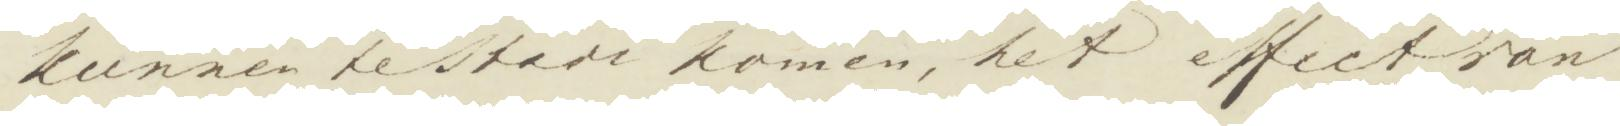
kunnen te stade komen, het effect van
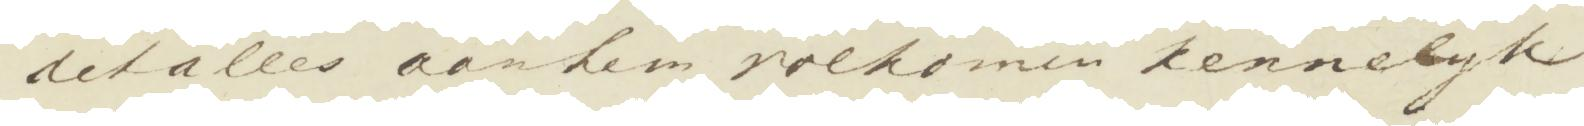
dit alles aan hem volkomen kennelyk
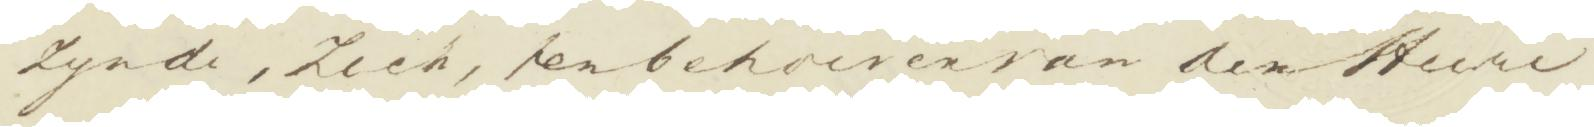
zynde, zich, ten behoeven van den Heere
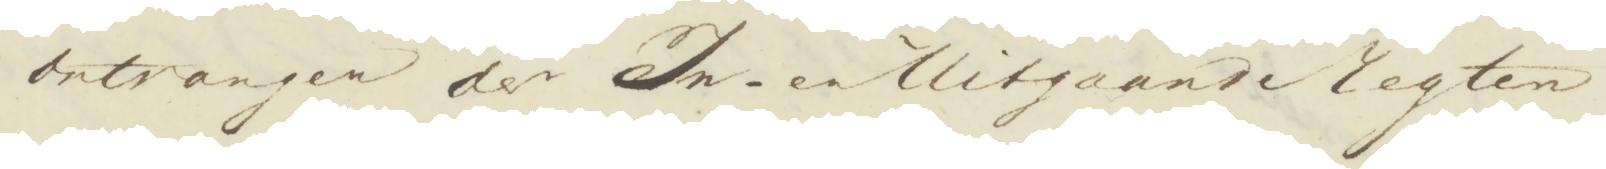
ontvangen den In- en Uitgaande regten
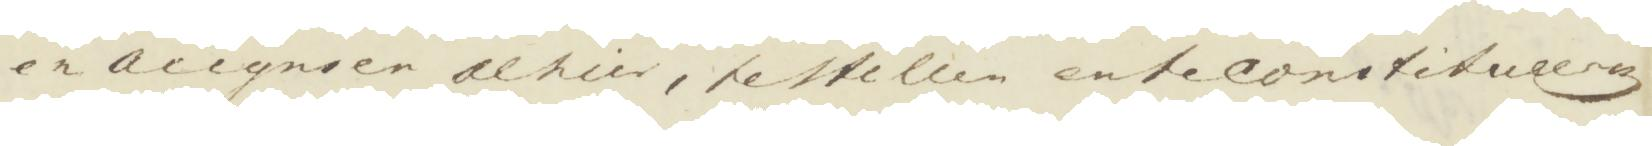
en accynsen alhier, te stellen en te constitueeren
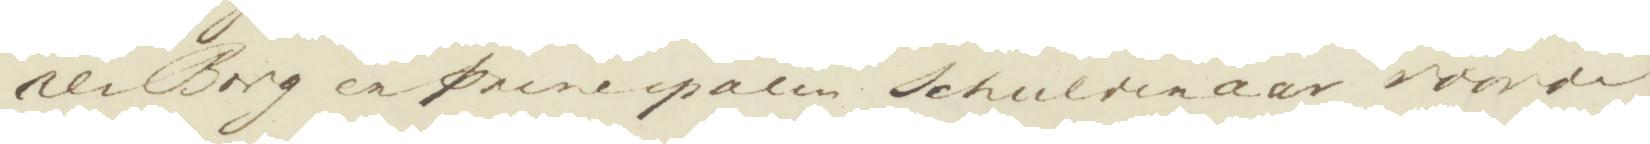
als Borg en principalen schuldenaar voor de
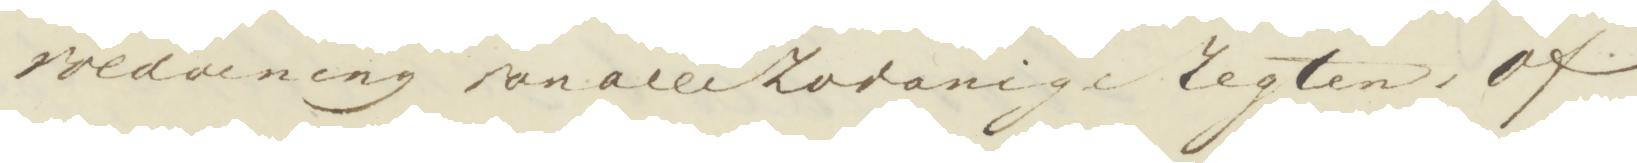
voldoening van alle Zodanige regten, of
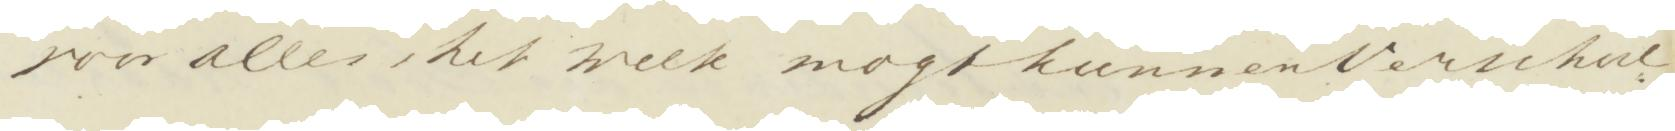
voor alles het welk mogt kunnen verschul
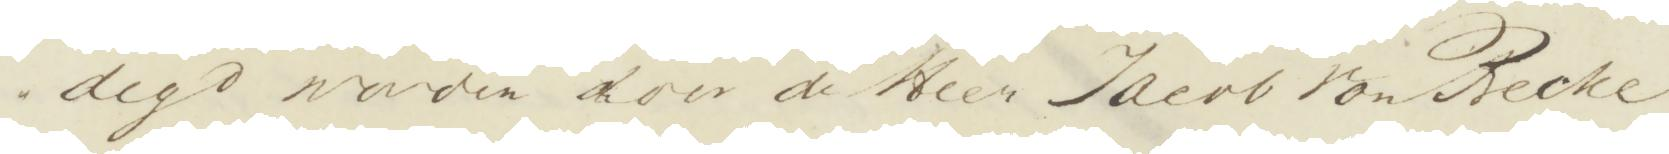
„digd worden door de Heer Iacob Van Becke
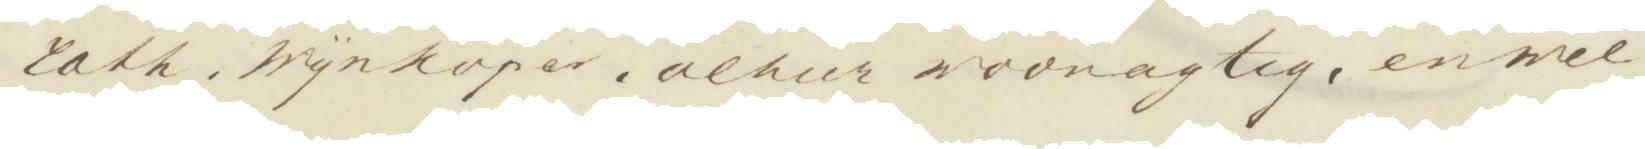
rath, wijnkoper, alhier woonagtig, en wel
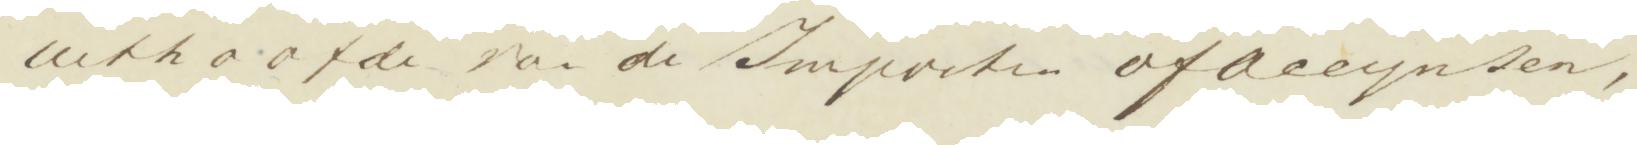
uithoofde van de Importen of accynsen,
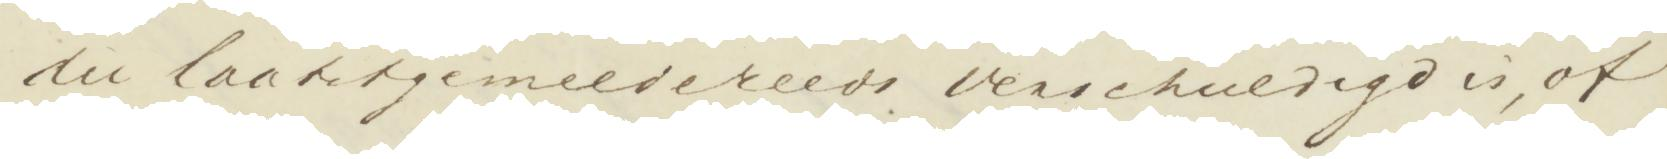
die laatstgemelde reeds verschuldigd is, of
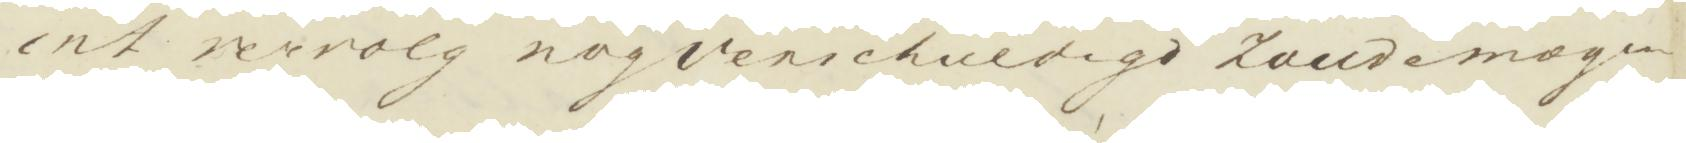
in't vervolg nog verschuldigd zoude mogen
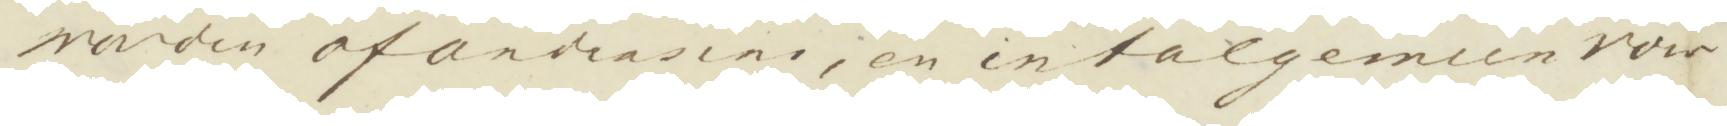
worden of andersint, en in 't algemeen voor
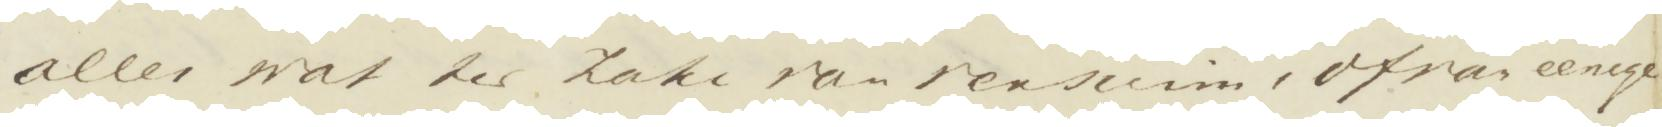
alles wat ter zake van versuim, of van eenige
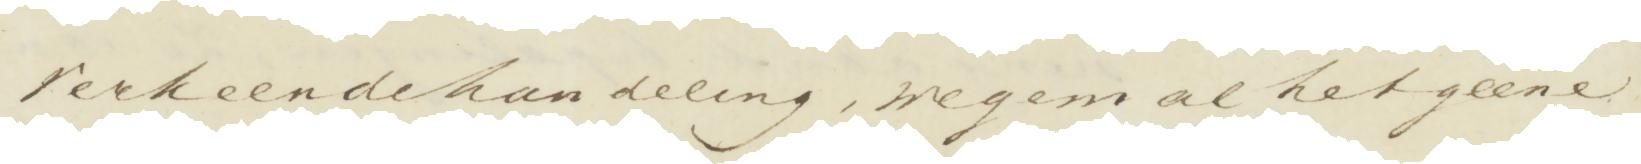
verkeerde handeling, wegens al het geene
